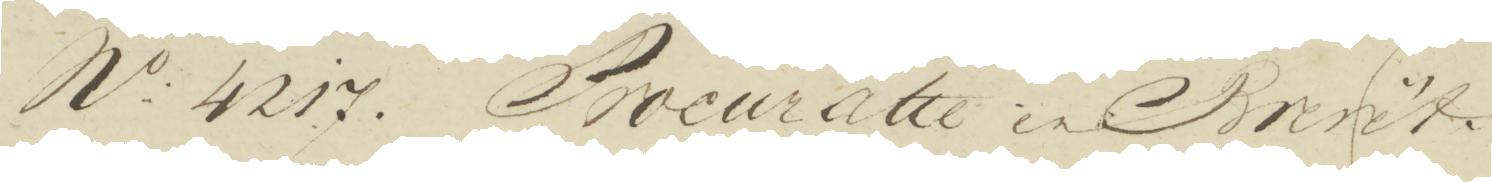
N:o 4217 Procuratie in Brevet.
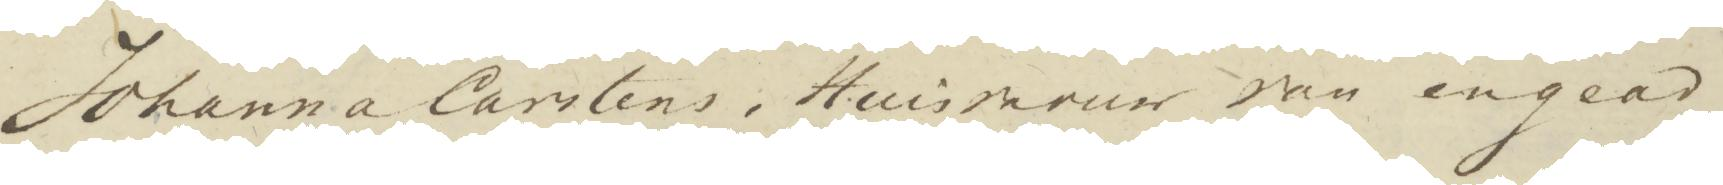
Johanna Carstens, Huisvrouw van en gead
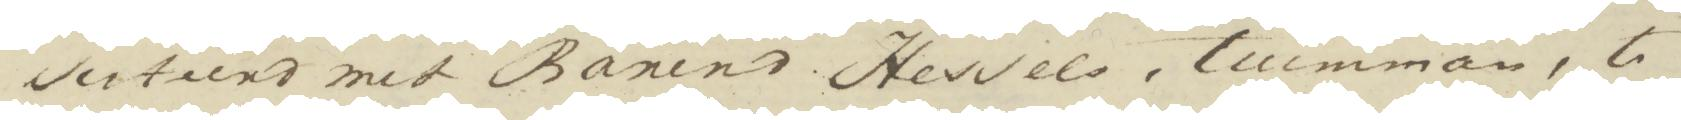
sisteerd met Barend Hessels, Tuimman, te
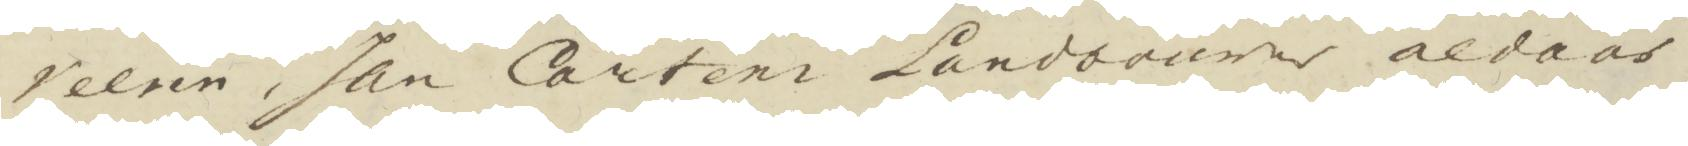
velsen, Jan Cartens Landbouwer aldaar
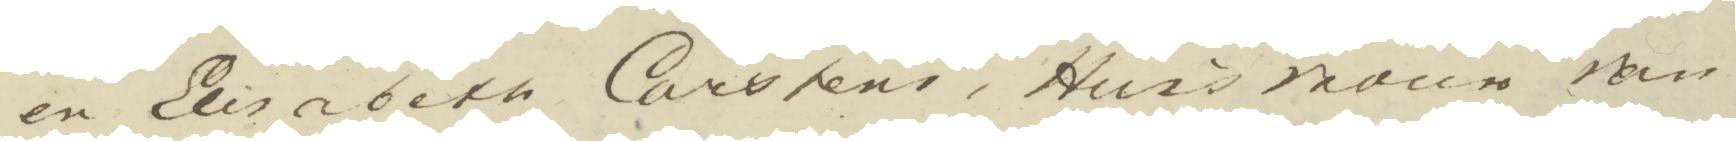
en Elisabeth Carstens, Huisvrouw van
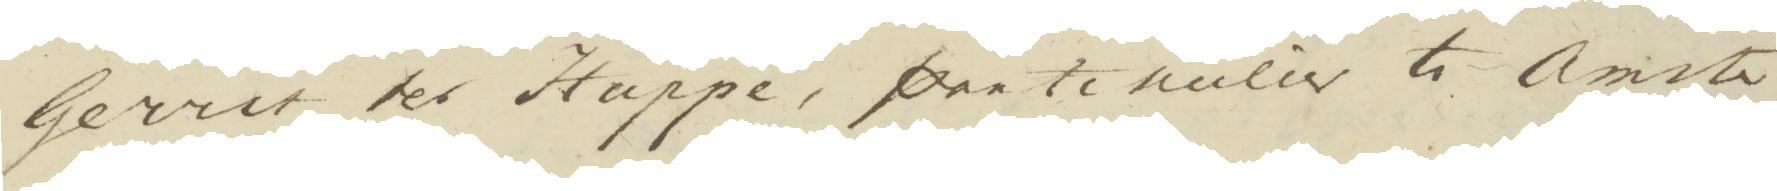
Gerrit ter Huppe, partikulier te Amste
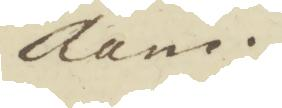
dam.
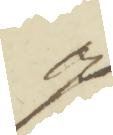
Gz
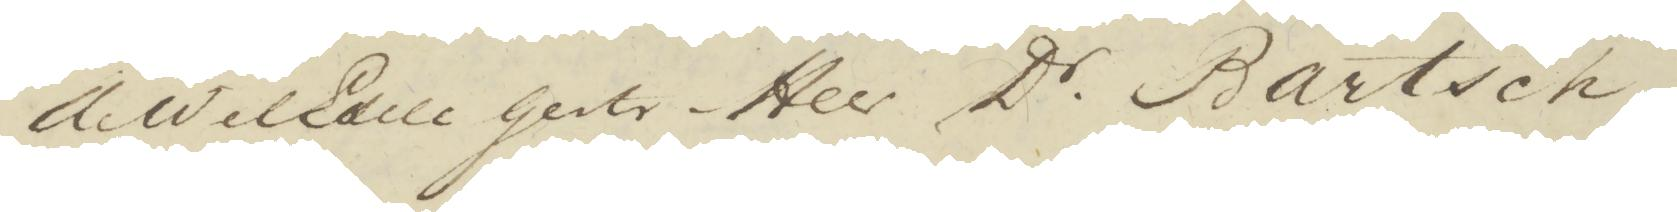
De welEdele gestr-Heer D.s Bartsch,
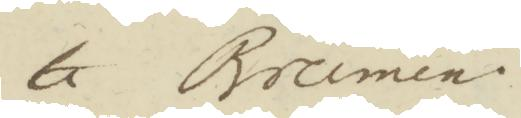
te Breemen.
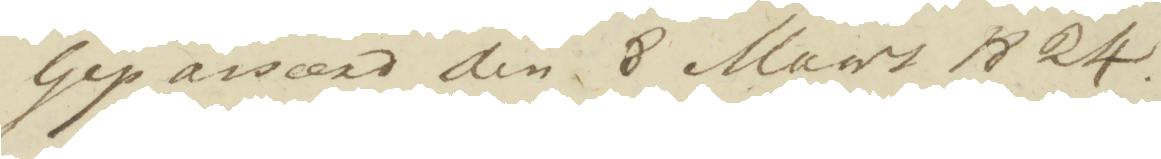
Gepasseerd den 8 Maart 1824.
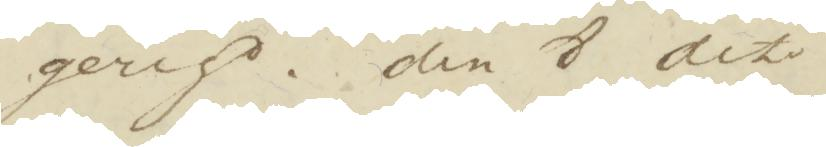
gerig:d den 8 dito
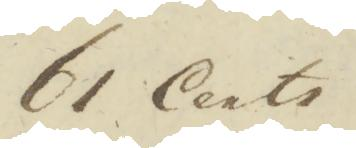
61 Cents
